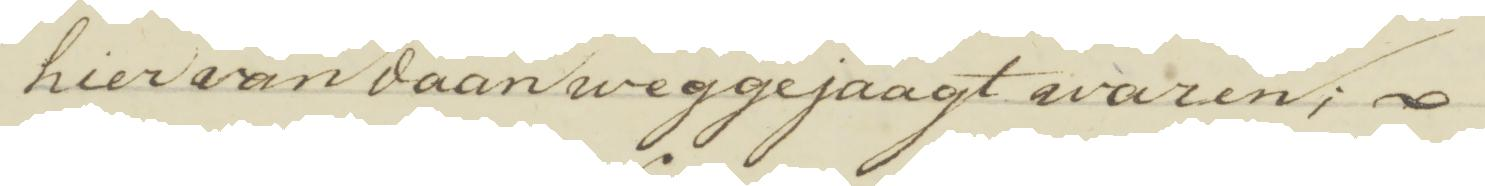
hier van daan weggejaagt waren;~
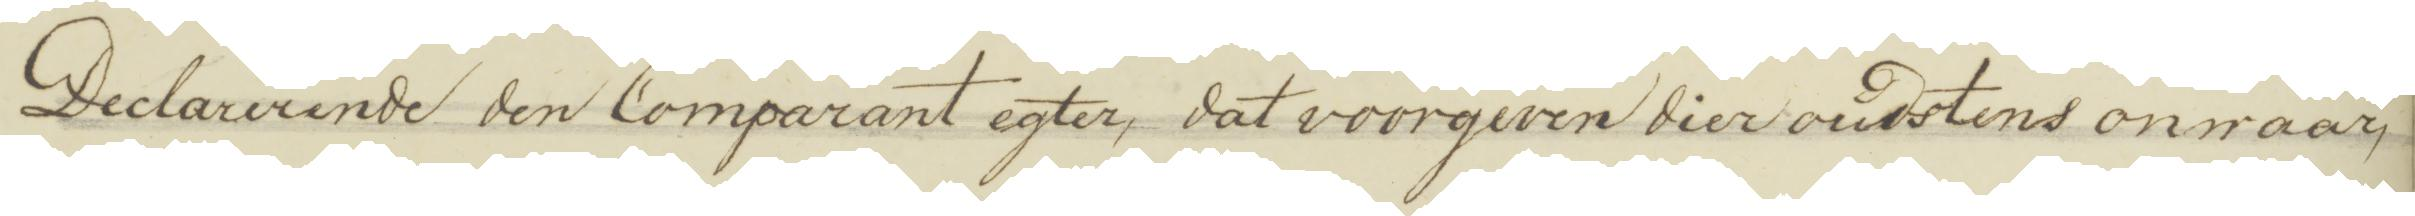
Declarerende den Comparant egter, dat voorgeven dier oudstens onwaar,
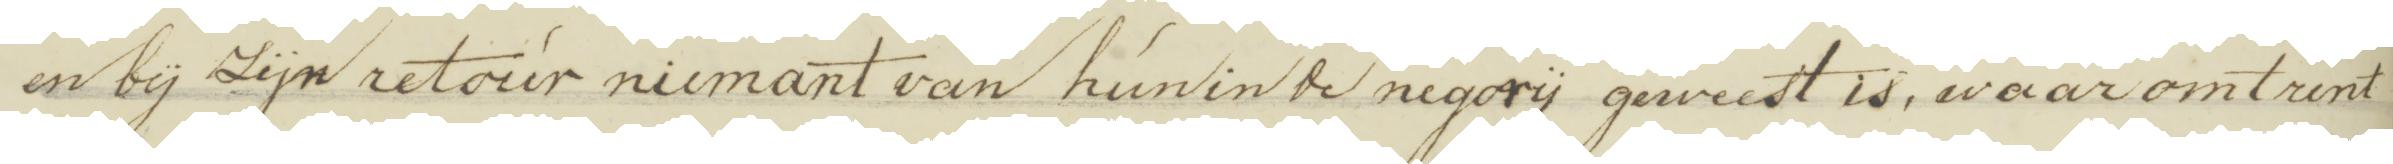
en bij Zijn retour niemant van hun in de negorij geweest is, waar omtrent
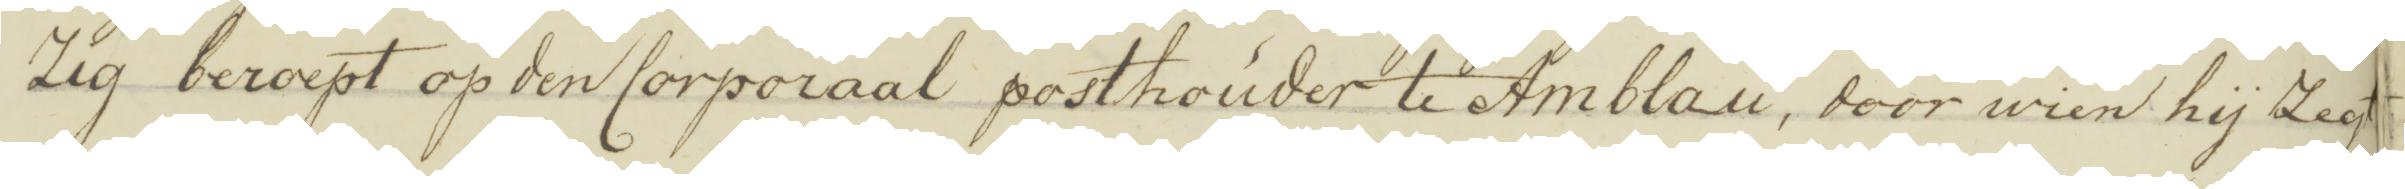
Zig beroept op den Corporaal posthouder te Amblau, door wien hij Zegt
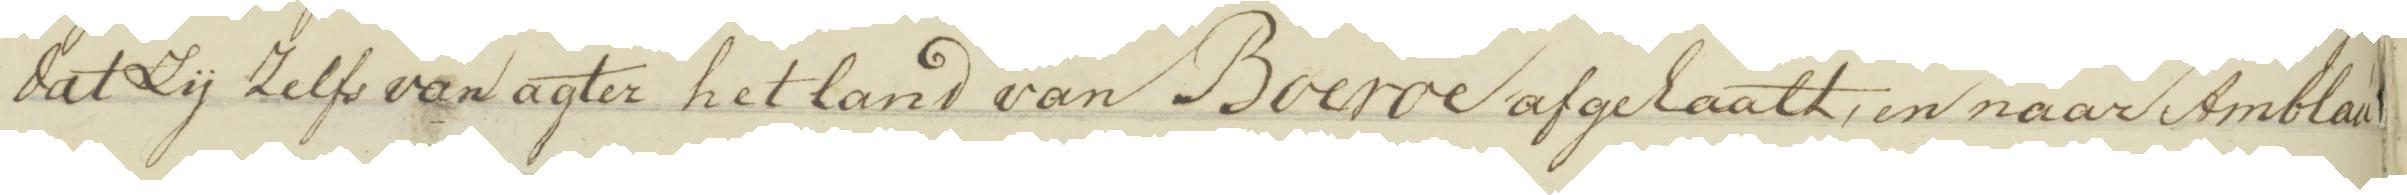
dat Zij Zelfs van agter het land van Boeroe afgehaalt, en naar Amblau
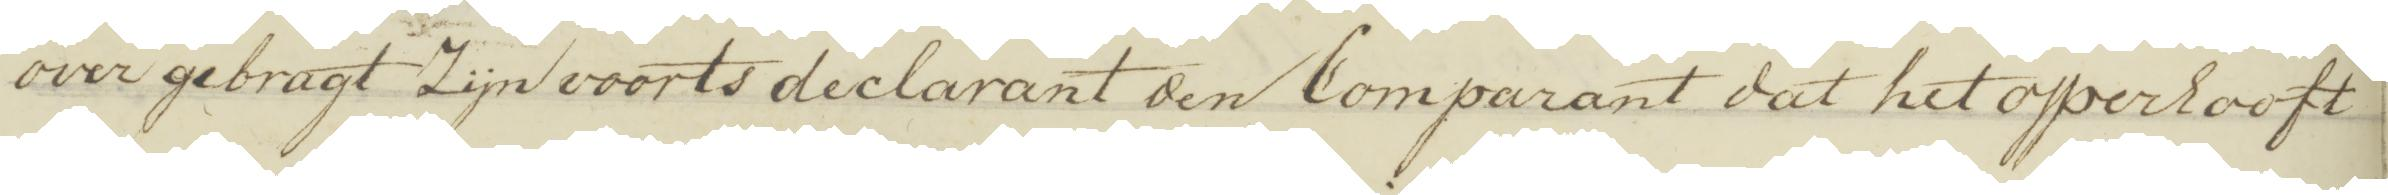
over gebragt Zijn voorts declarant den Comparant dat het opperhooft
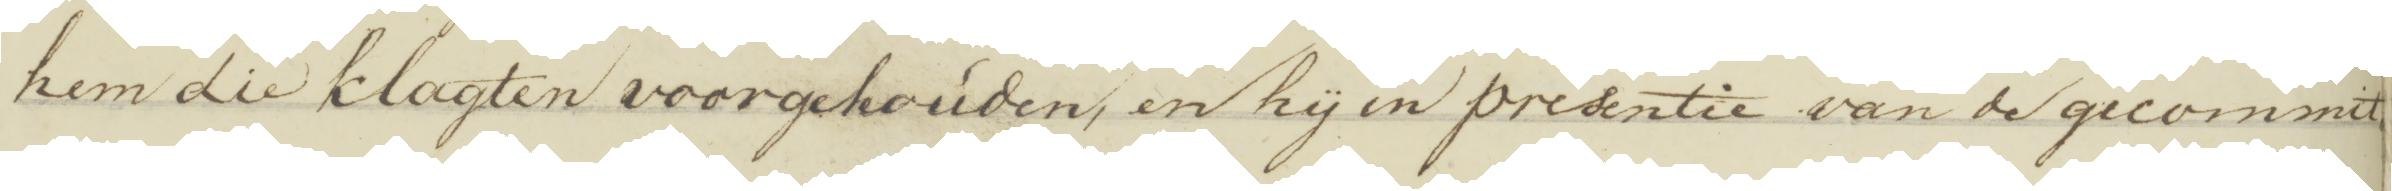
hem die klagten voorgehouden, en hij in presentie van de gecommit„
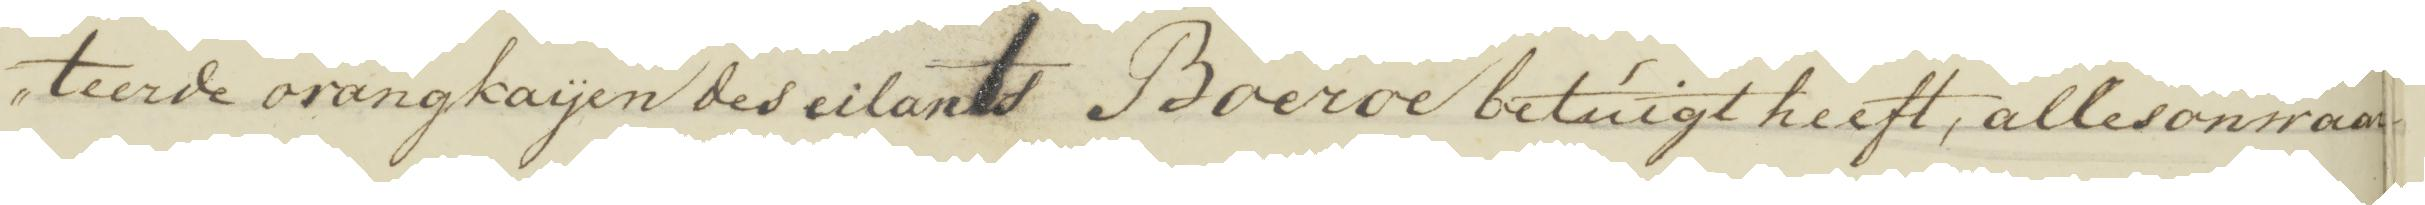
„teerde orangkaijen des eilants Boeroe betuigt heeft, alles onwaar
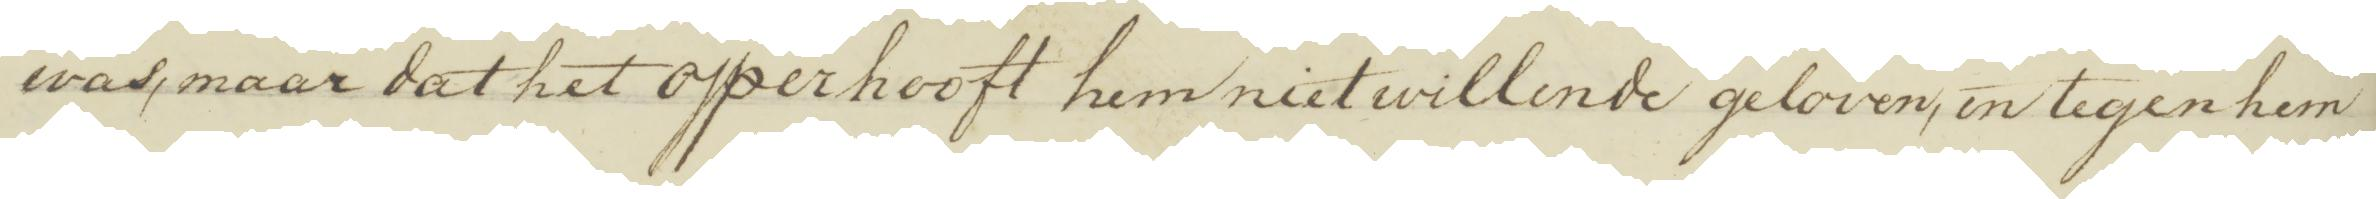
was, maar dat het opperhooft hem niet willende geloven, in tegen hem
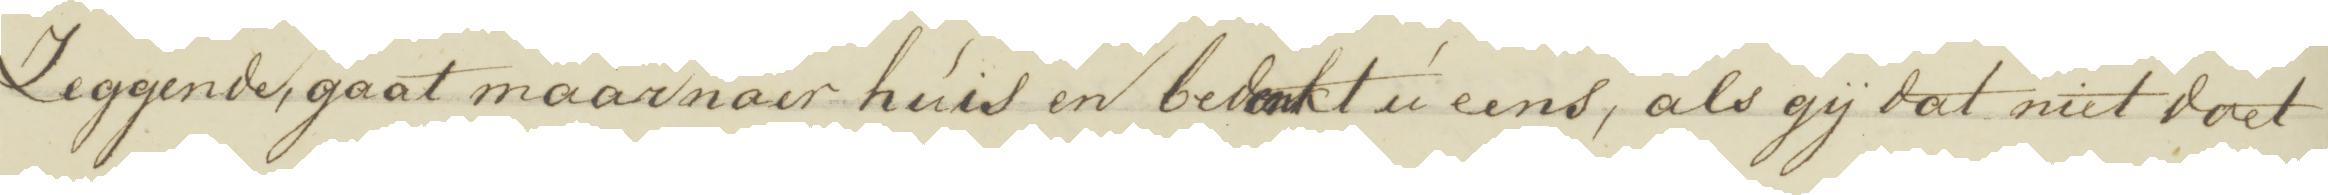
Zeggende, gaat maar naer huis en bedenkt u eens, als gij dat niet doet
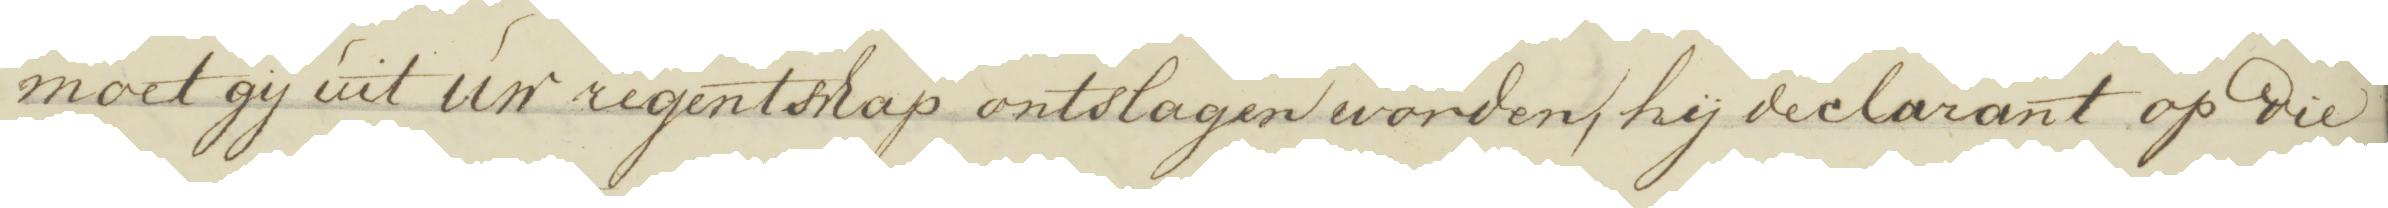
moet gij uit uw regentschap ontslagen worden, hij declarant op die
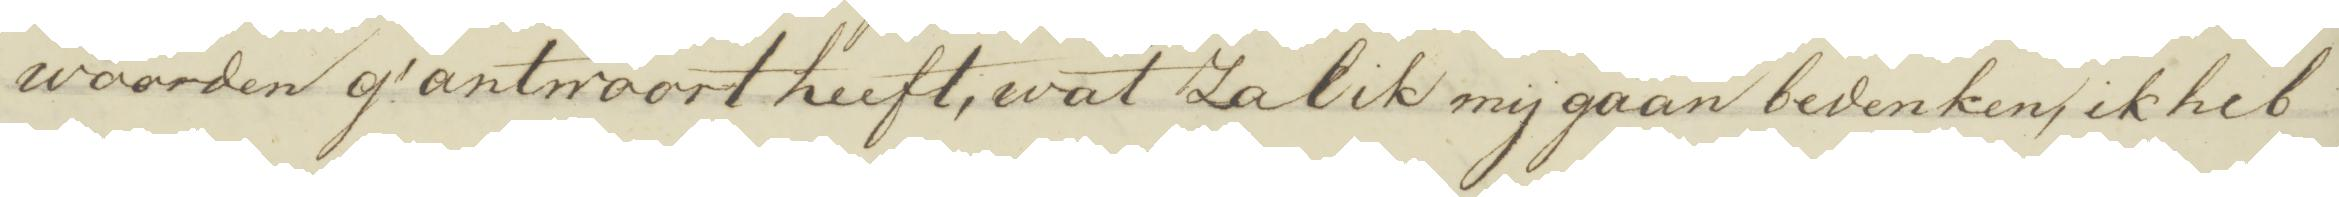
woorden g’antwoort heeft, wat Zal ik mij gaan bedenken, ik heb
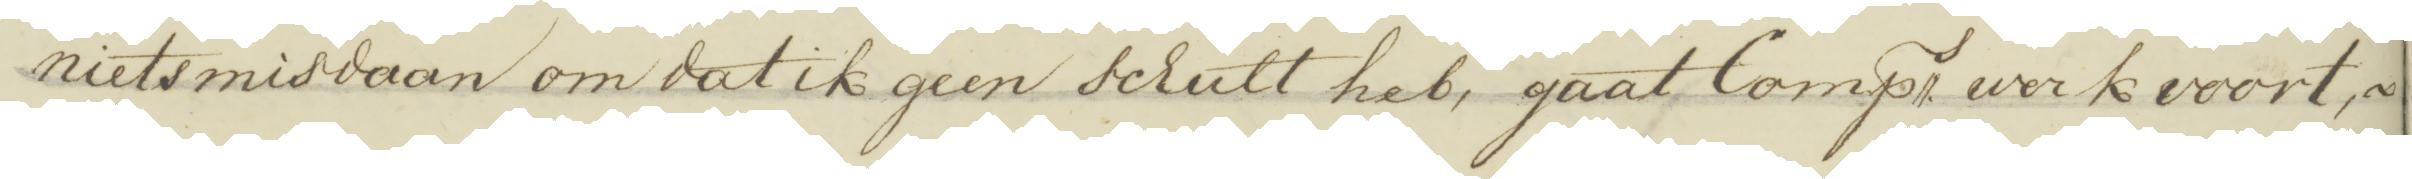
niets misdaan om dat ik geen Schult heb, gaat Comp„s werk voort,~
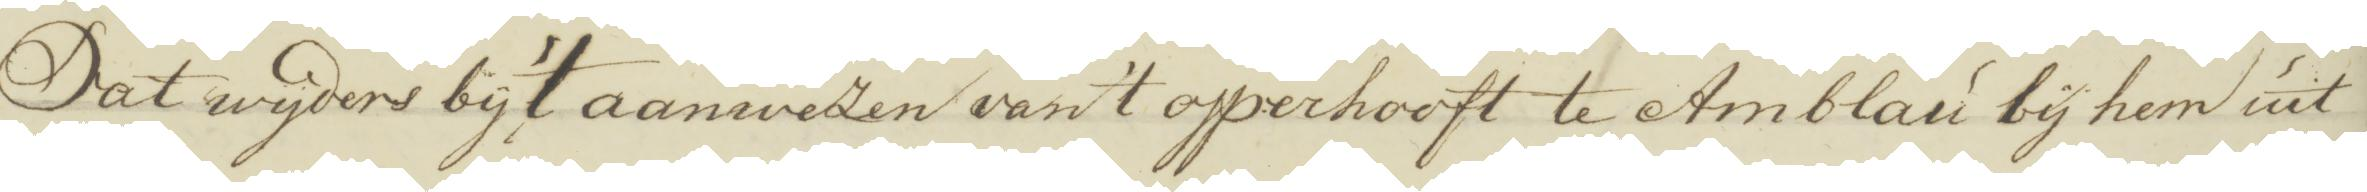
Dat wijders bij ’t aanwezen van ’t opperhooft te Amblau bij hem uit
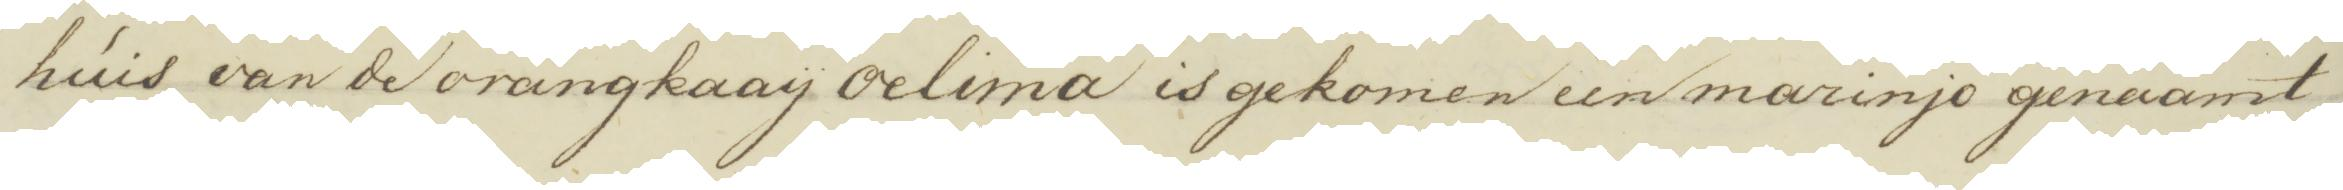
huis van de orangkaaij oelima is gekomen een marinjo genaamt
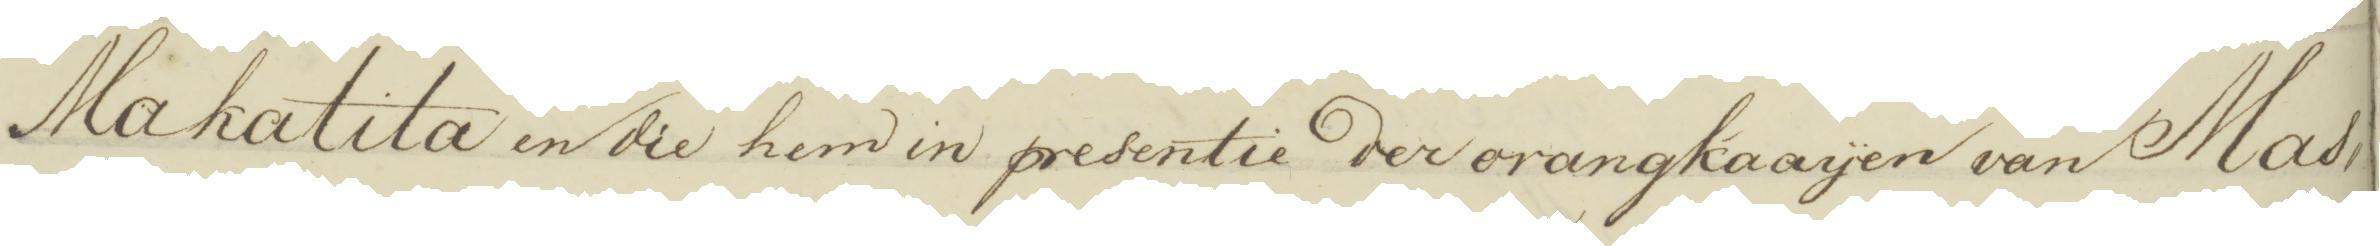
Makatita en die hem in presentie der orangkaaijen van Mas„
